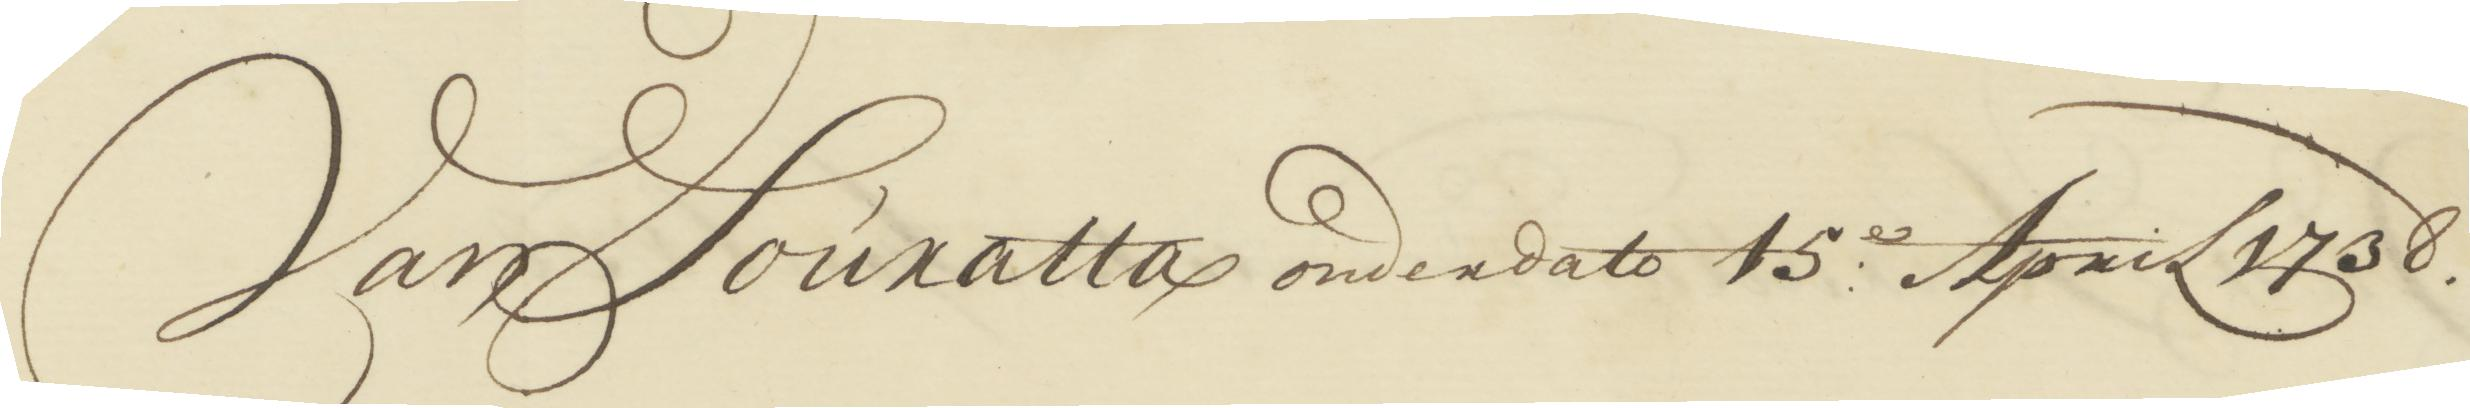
Van Souratta onderdato 15:e April 1738.
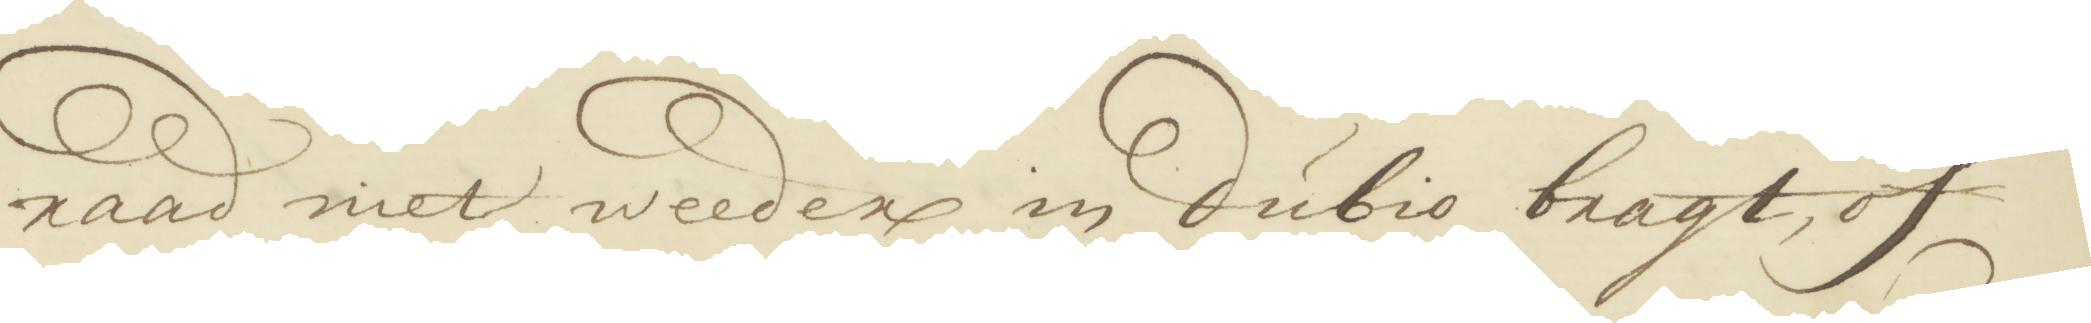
raad niet weeder in dubio bragt, of
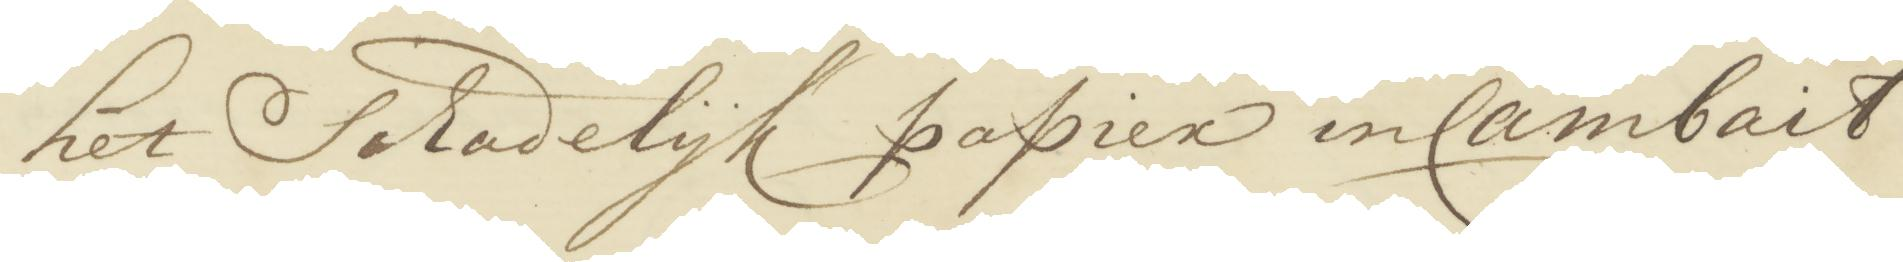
het schadelijk papier in Cambait
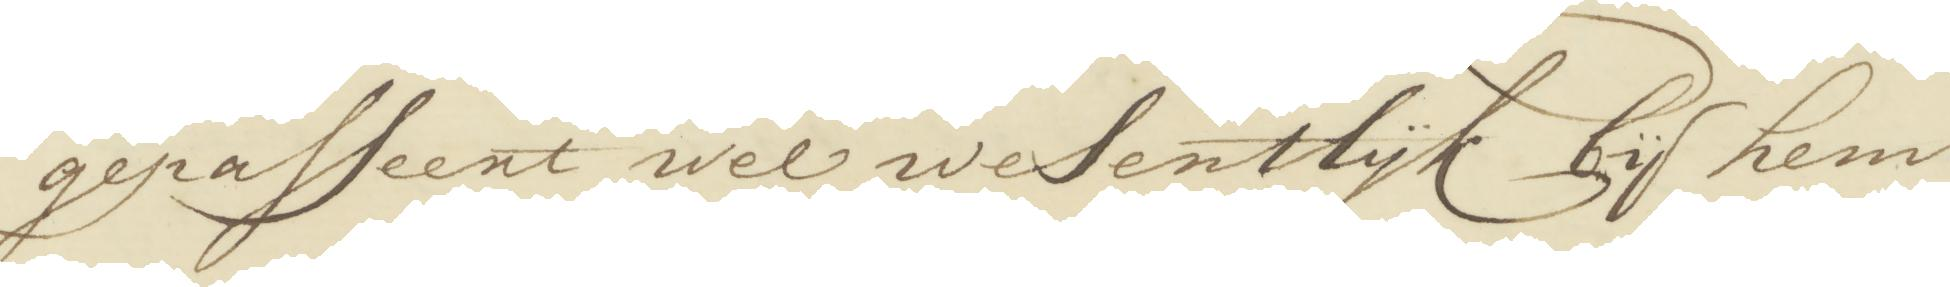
gepasseert wel wesentlijk bij hem
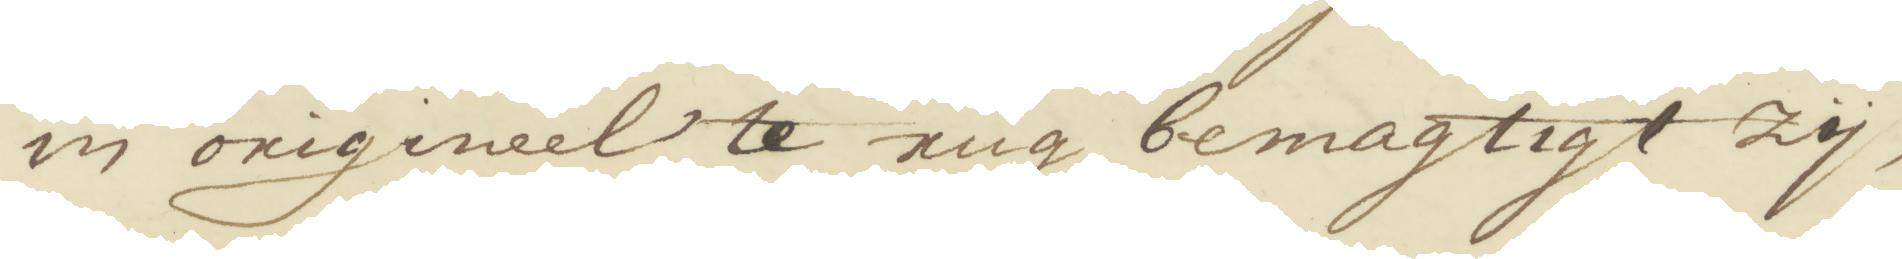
in origineel te rug bemagtigt zij,
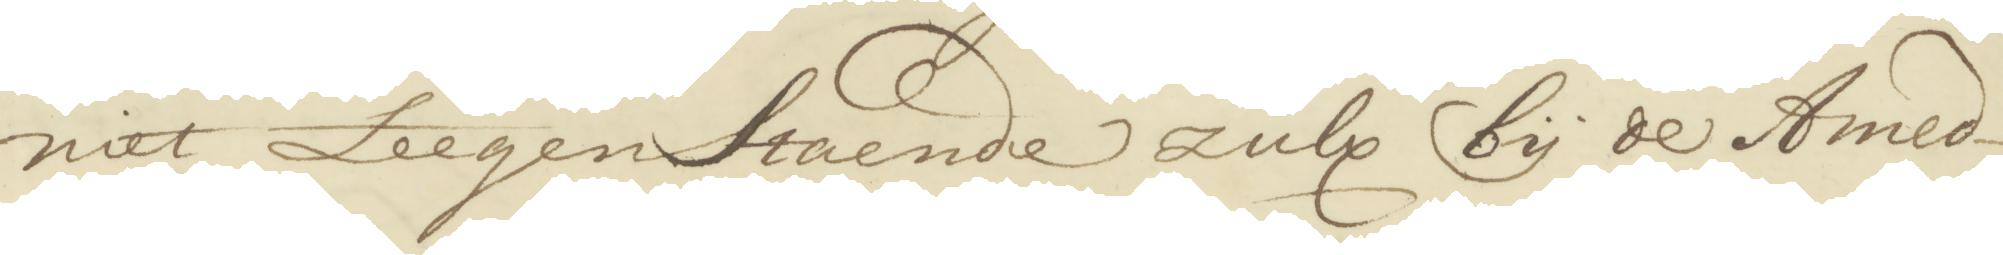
niet teegenstaende zulx bij de Amed-
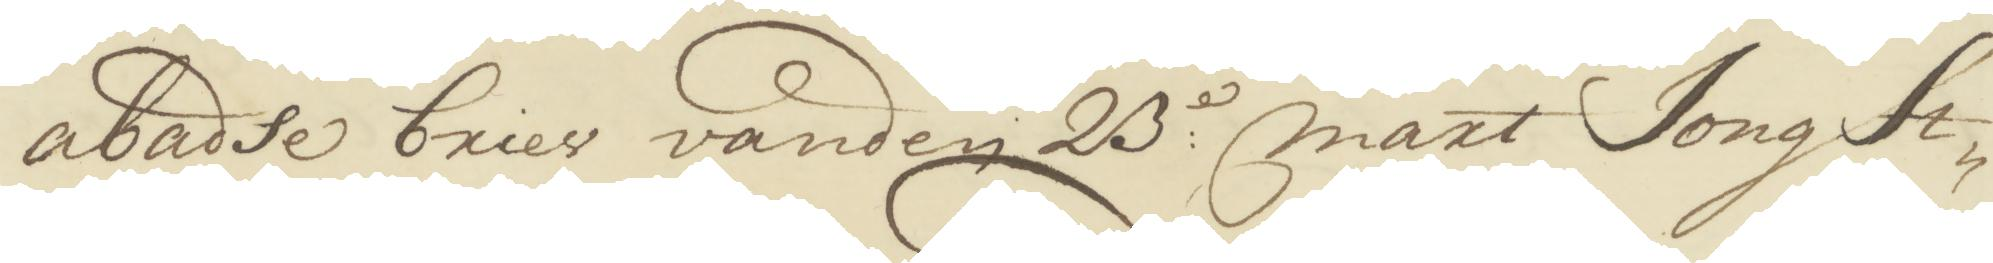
abadse briev vanden 23:e Mart Jongst„
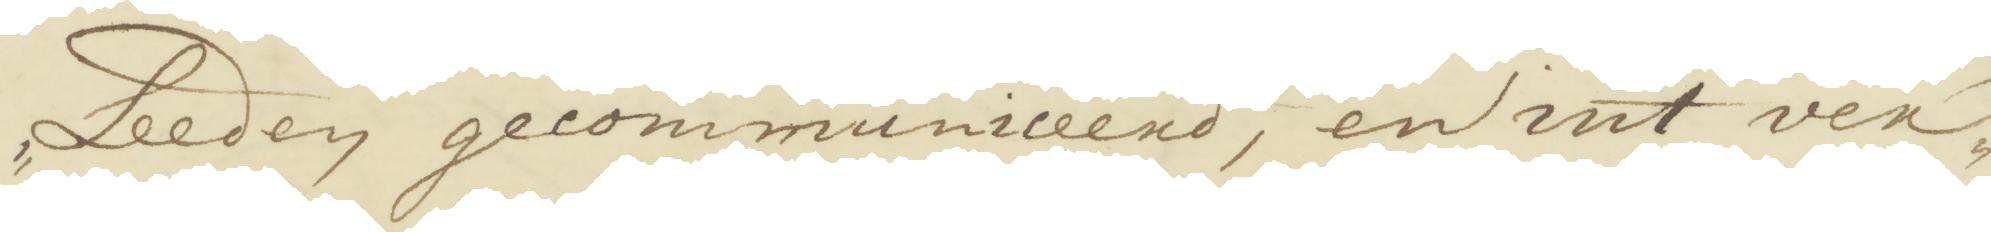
„Leeden gecommuniceerd, en in't ver„
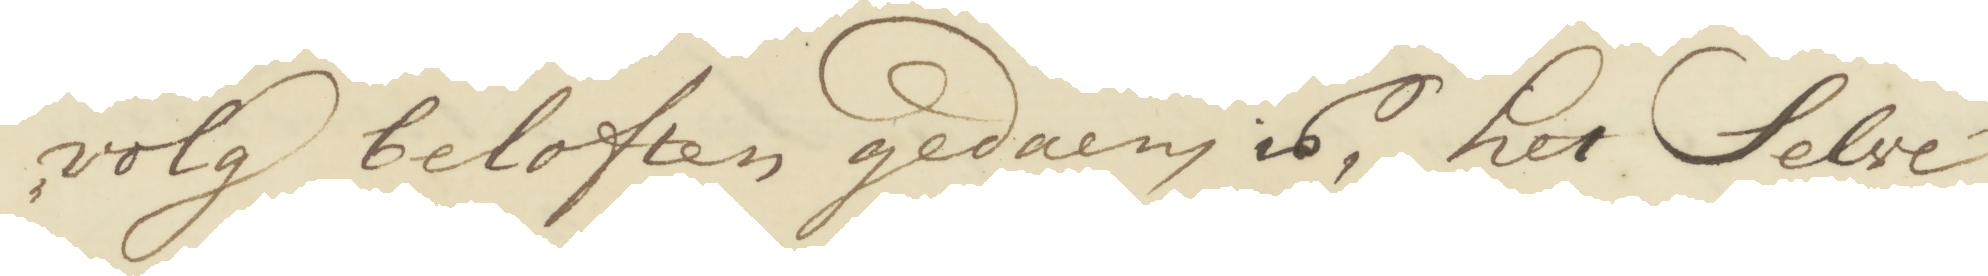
„volg beloften gedaen is, het selve
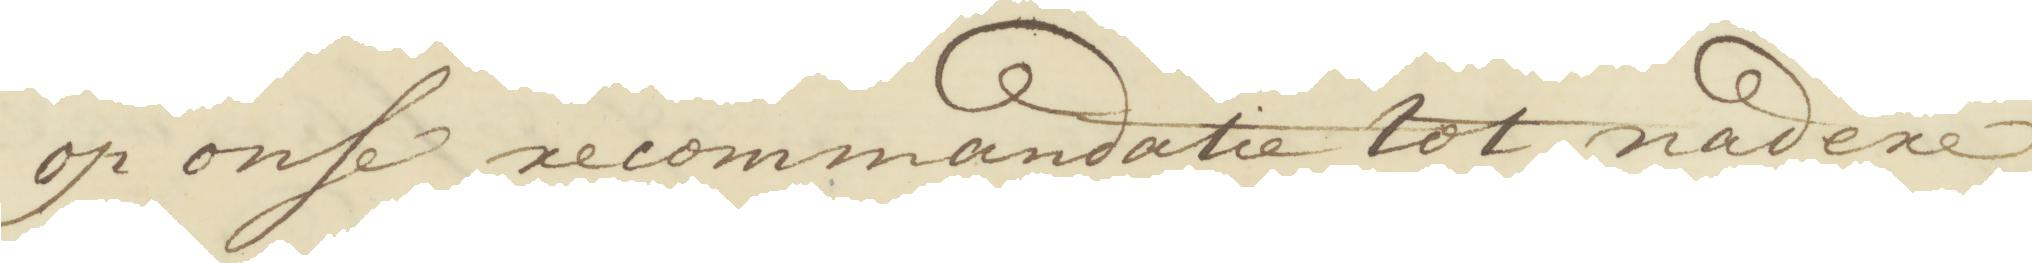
op onse recommandatie tot nadere
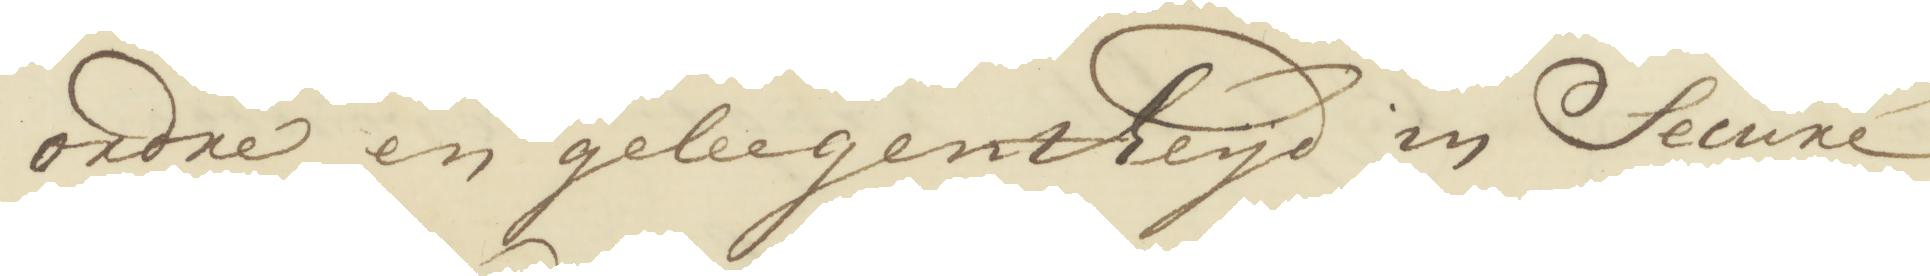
ordre en geleegentheijd in secure
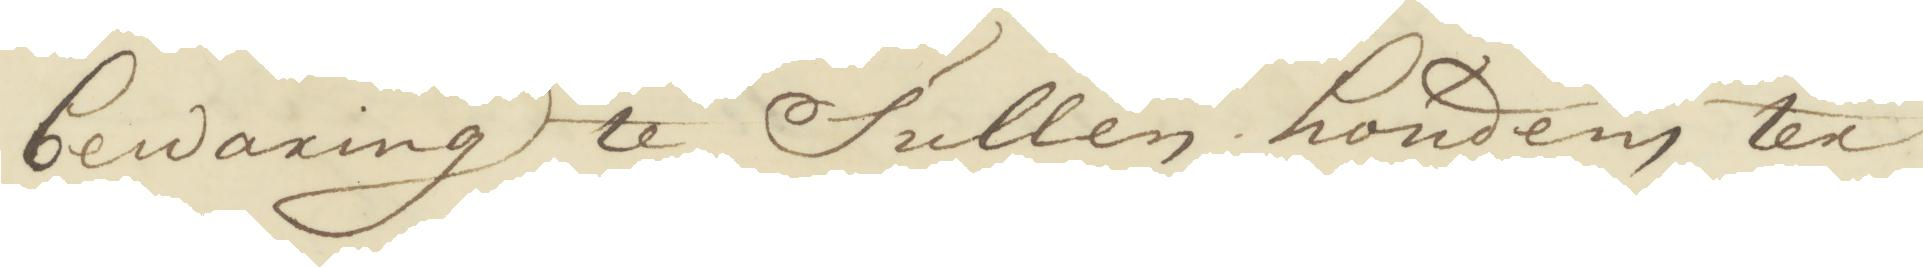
bewaring te sullen houden ter
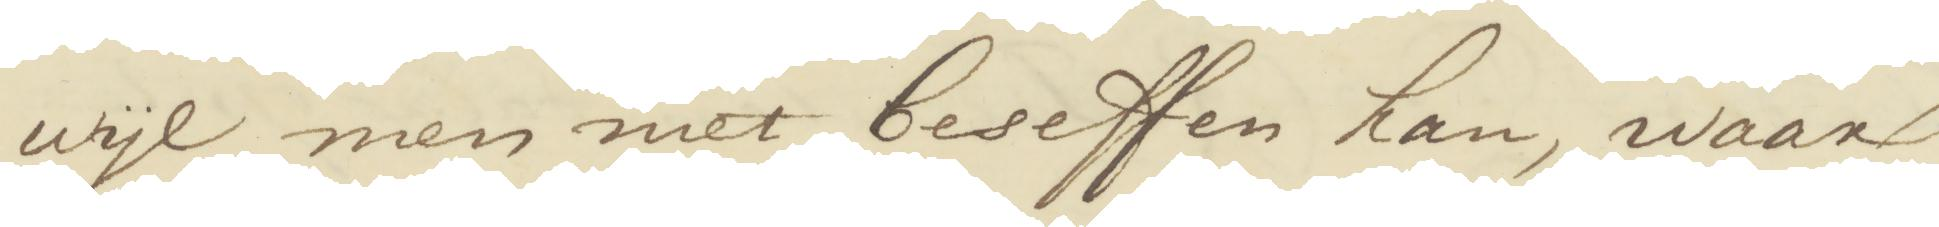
wijl men niet beseffen kan, waar
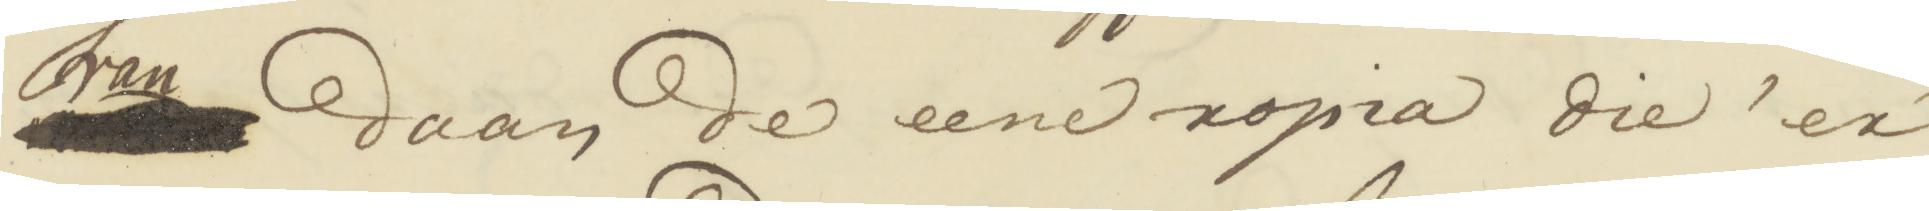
van daan de eene ropia die 'er
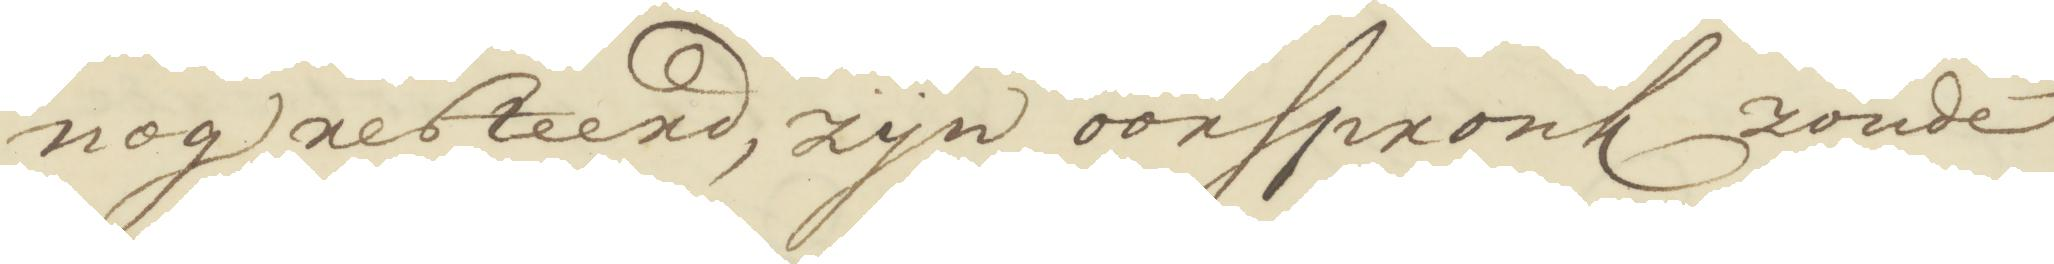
nog resteerd, zijn oorspronk zoude
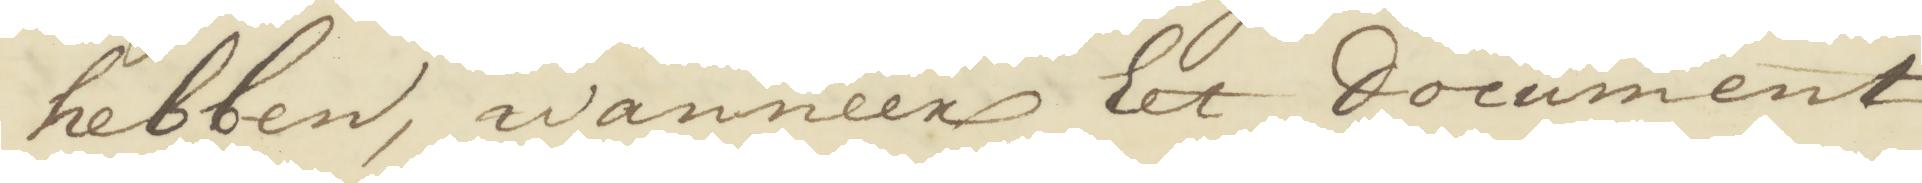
hebben, wanneer het document
